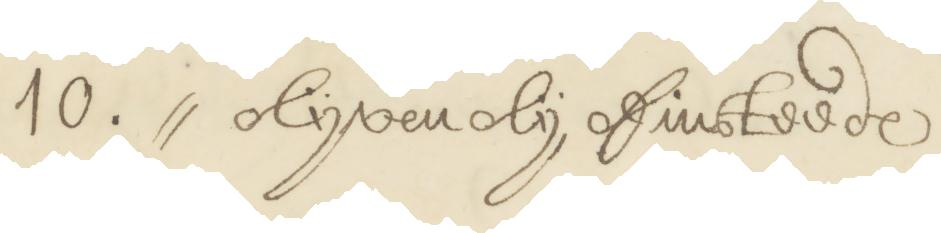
10. „ olijvenolij of insteede
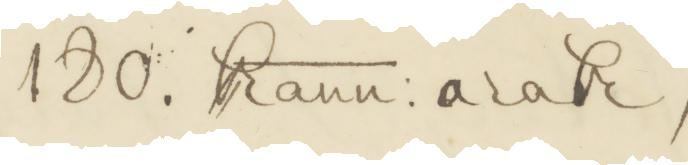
180. „ kann: arak
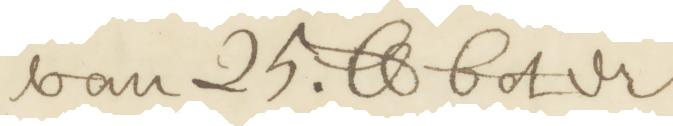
van 25. lb boter
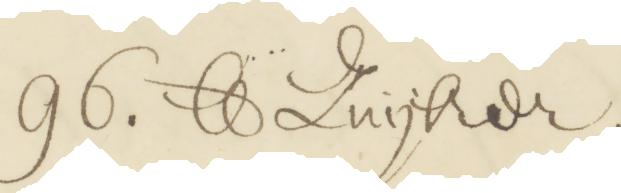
96. lb zuijker
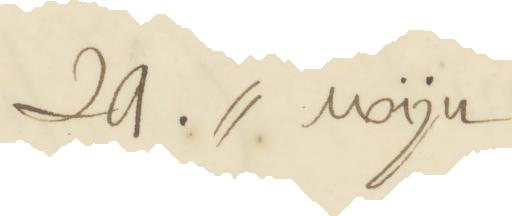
24. „ wijn
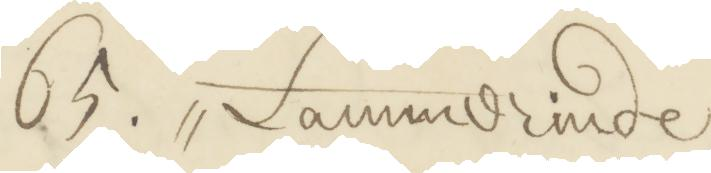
65. „ tammerinde
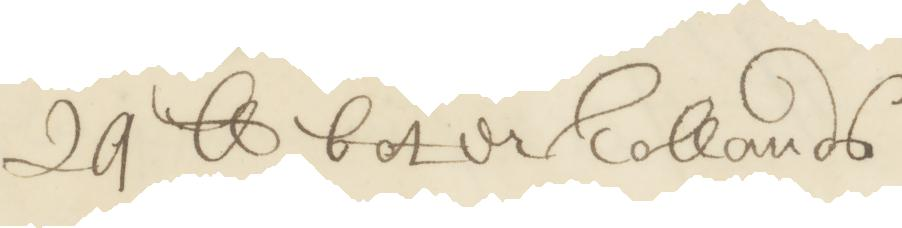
24 lb boter hollands
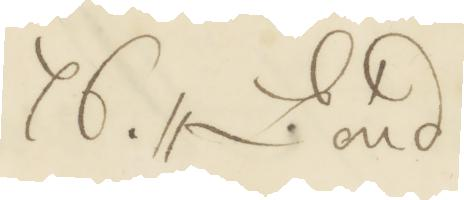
76. „ zoud
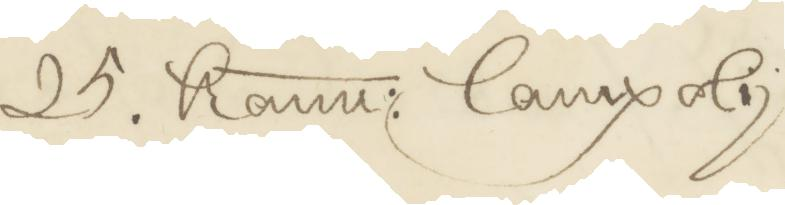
25. kann: lampolij
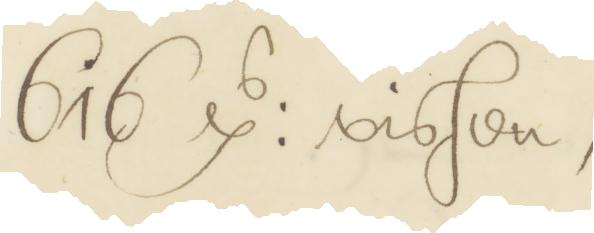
616 p:s vissen
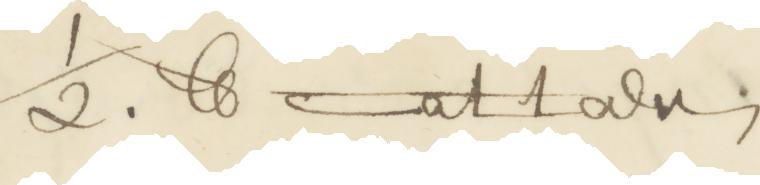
½. lb cattoen.
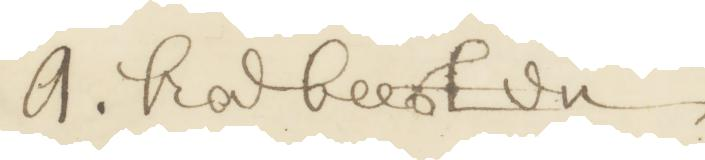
4. koebeesten
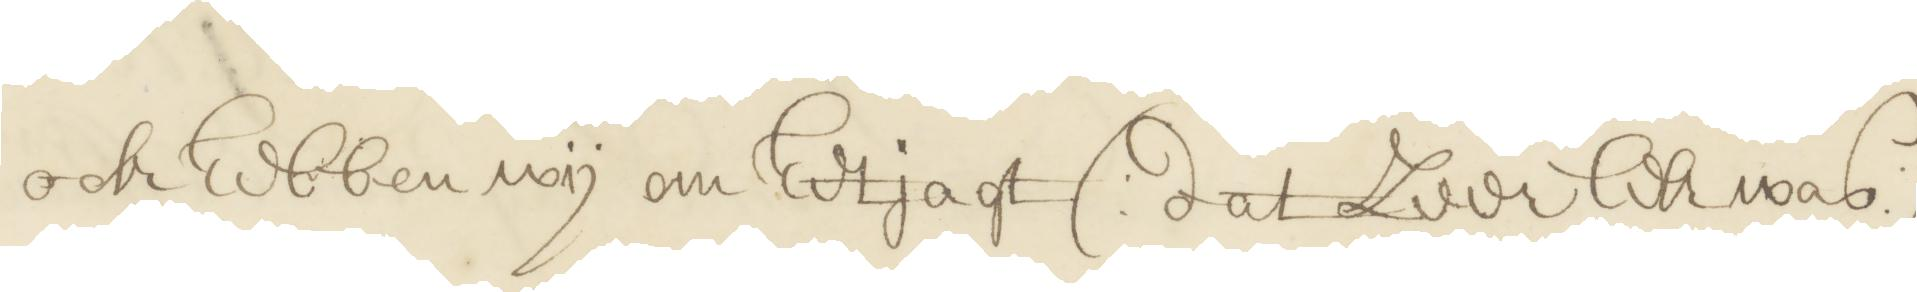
ook hebben wij om hetjagt (:dat zeer lek was:
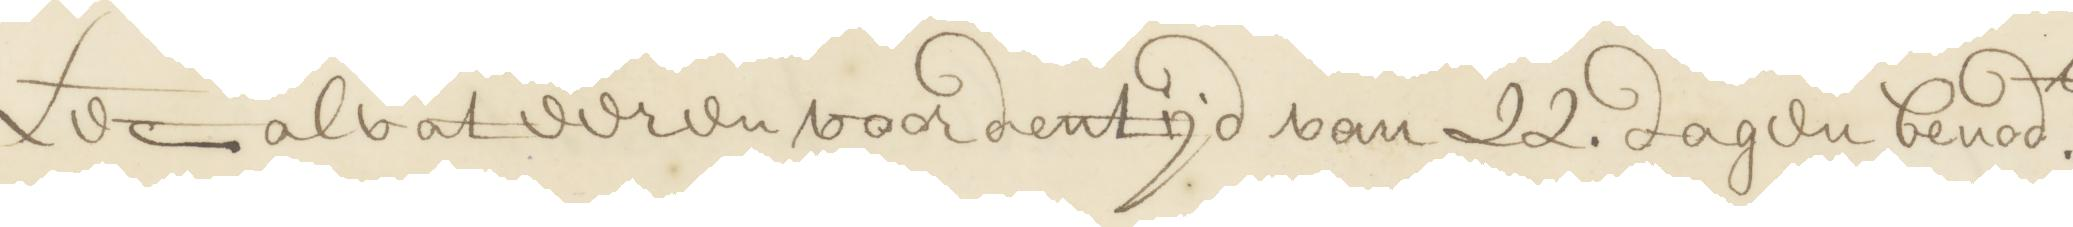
te calvateeren voor dentijd van 22. dagen benodt
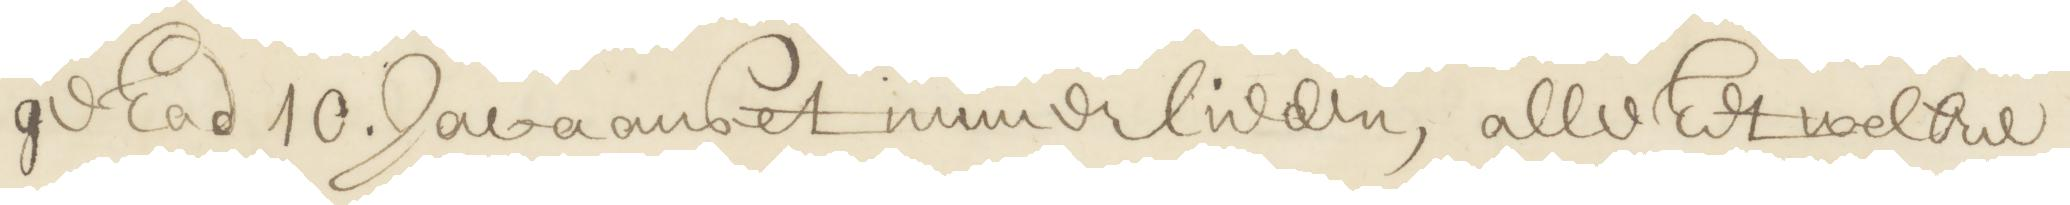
gehad 10. Javaansetimmerlieden, alle het welke
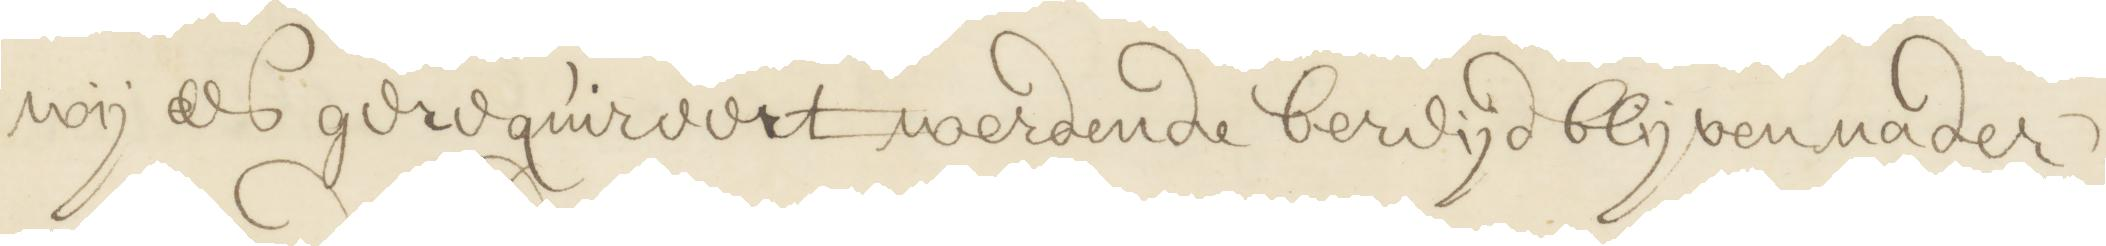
wij des gerequireert werdende bereijd blijven nader
